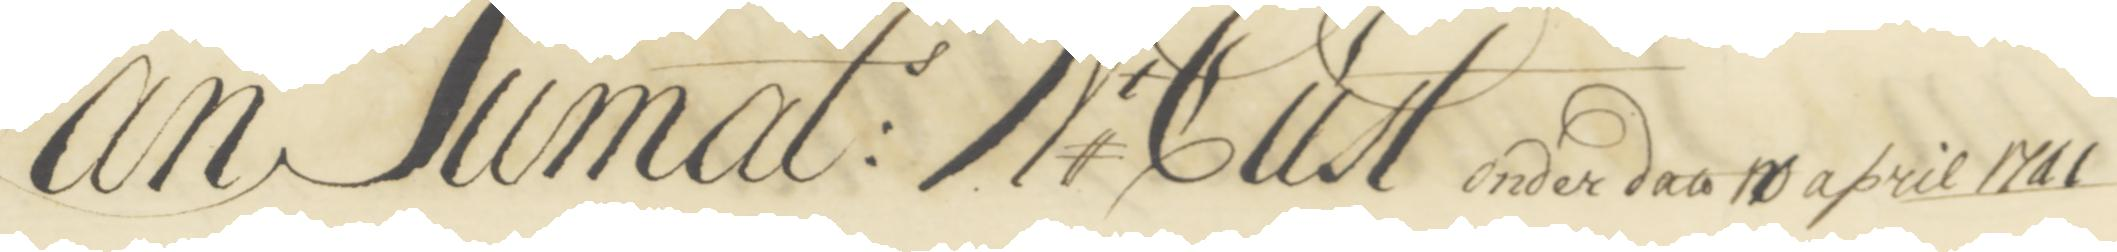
an Sumat:s W„t Cust onder dato 10 april 1741
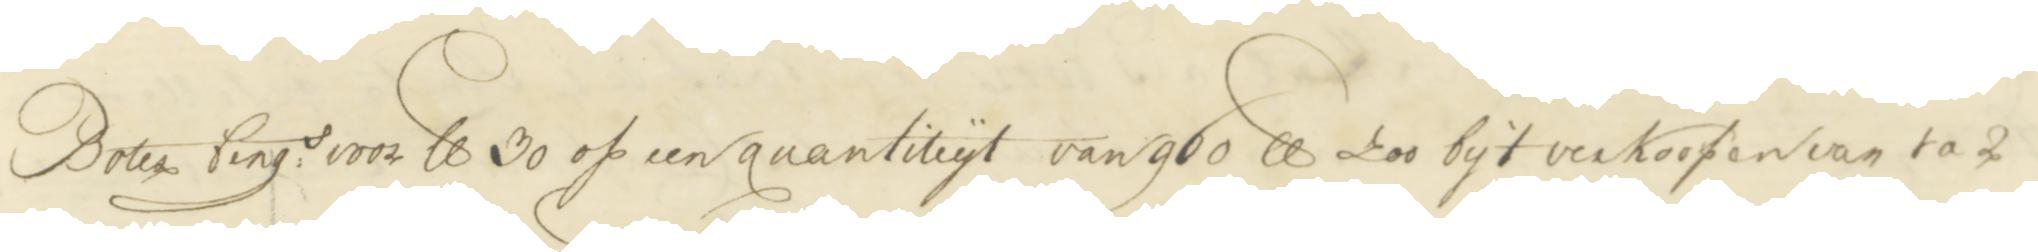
Boter fing:s voor lb 30 op een quantiteijt van 960 lb zoo by't verkoopen van 1 a 2
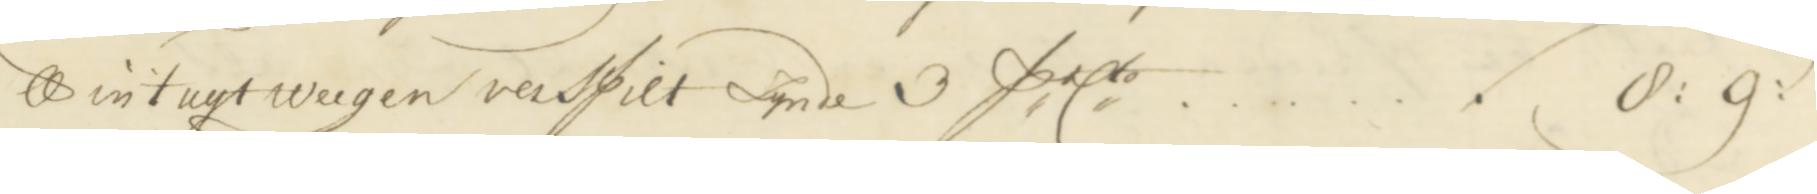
lb in 't uyt weegen verspilt zynde 3 p„r c„to . . . . . . ƒ 8: 9:
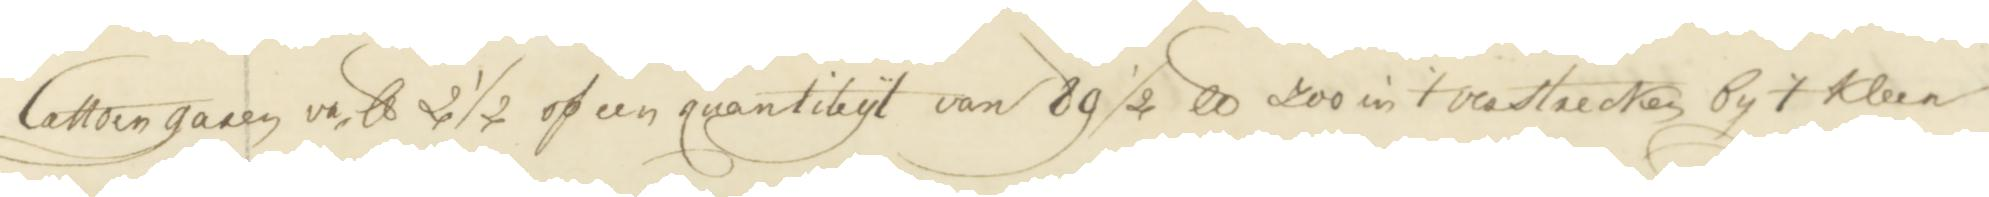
Cattoen garen va„ lb 2½ op een quantiteijt van 89½ lb zoo in ’t verstrecken bij ’t kleen
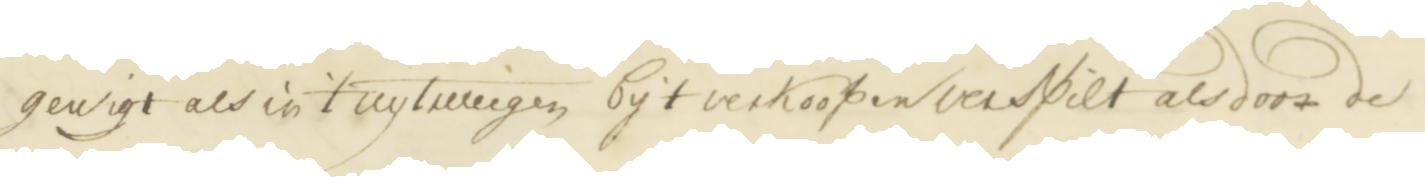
gewigt als in 't uijtweegen bij ’t verkoopen verspilt als door de
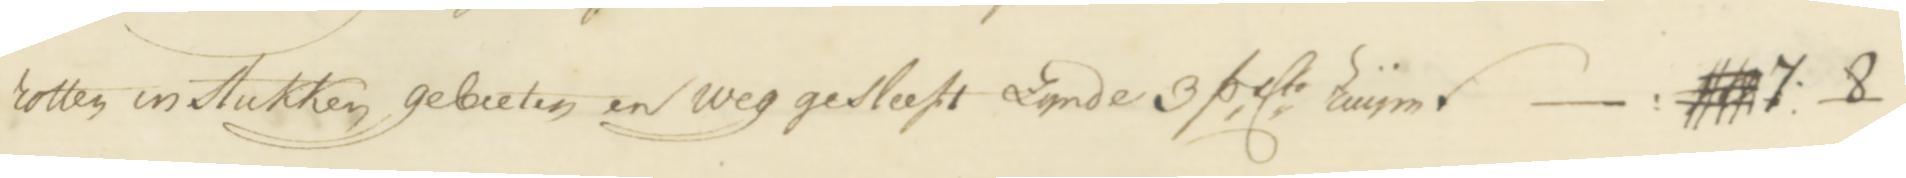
rotten in stukken gebeeten en weg gesleept zynde 3 p„r c„to ruijm ƒ —:107: 8
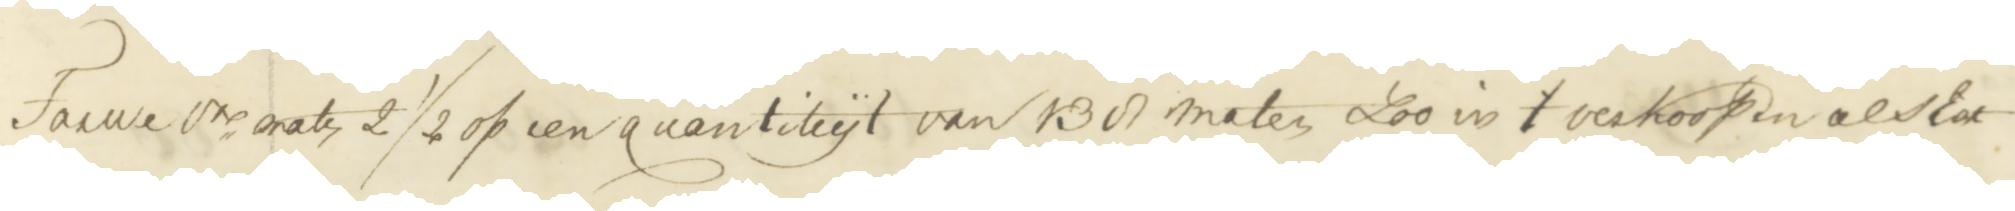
Tarwe v„r waten 2½ op een quantiteijt van 138 maten zoo in ’t verkoopen als tot
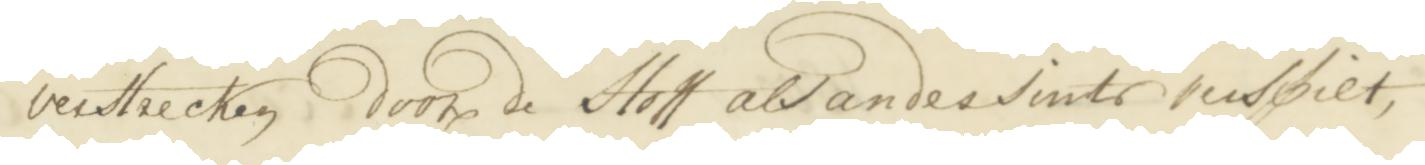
verstrecken door de stoff als andersints verspilt,
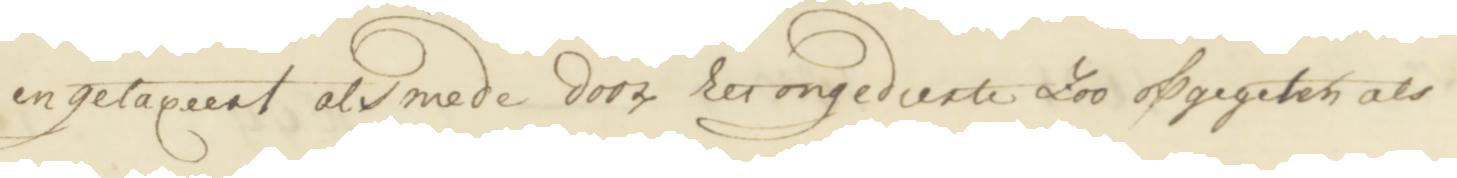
en gelaxeert als mede door het ongedierte zoo opgegeten als
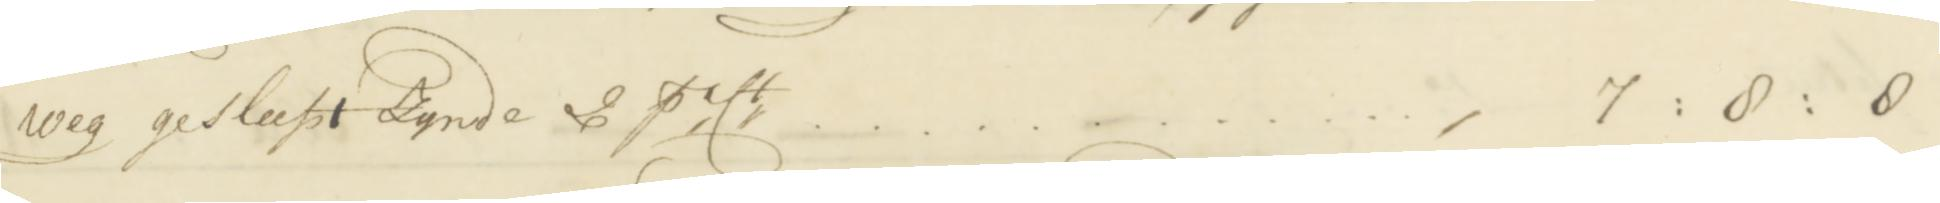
weg gesleept zynde 2 p„r c„t . . . . . . . . . . . . , 7: 8: 8
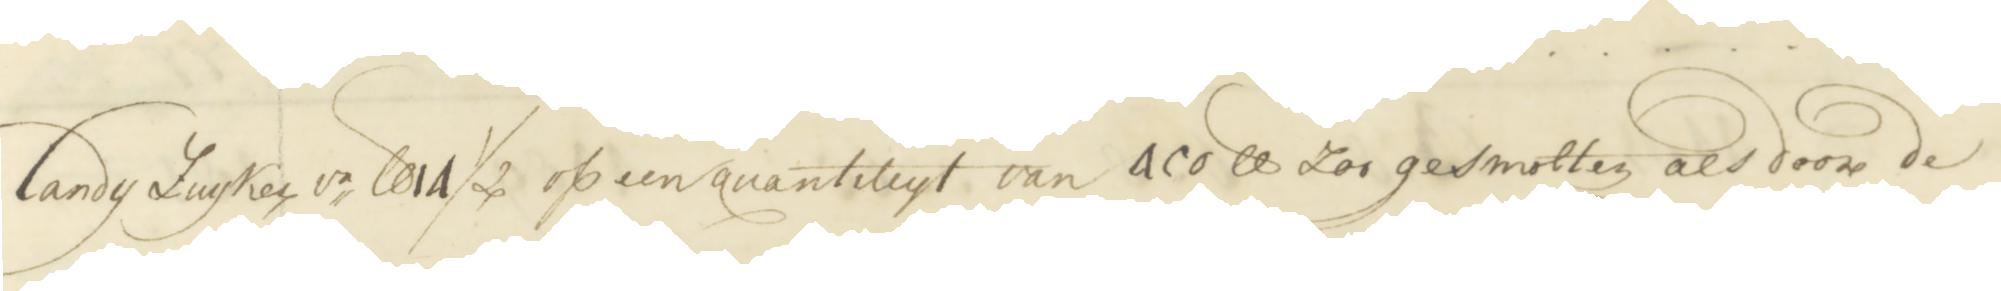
Candy zuijker v„r lb 14½ op een quantiteyt van 450 lb zoo gesmolten als door de
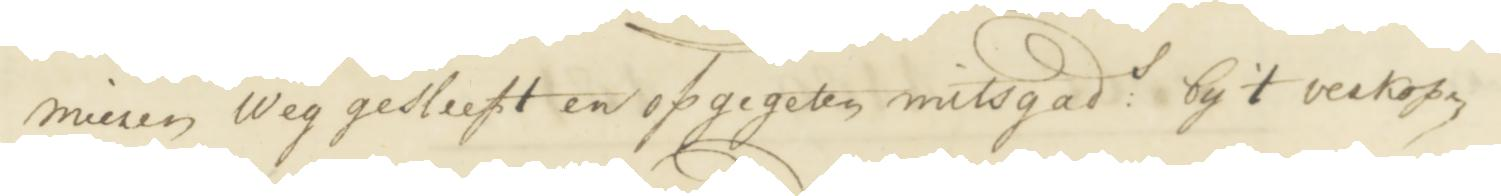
mieren weg gesleept en opgegeten mitsgad:s by ’t verkopen
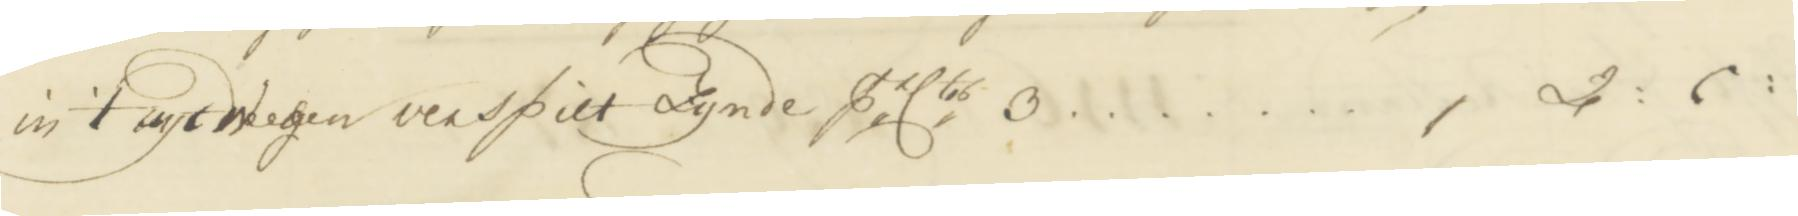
in ’t uytweegen verspilt zynde p„t c„tos 3 . . . . . . . , 2: 5:
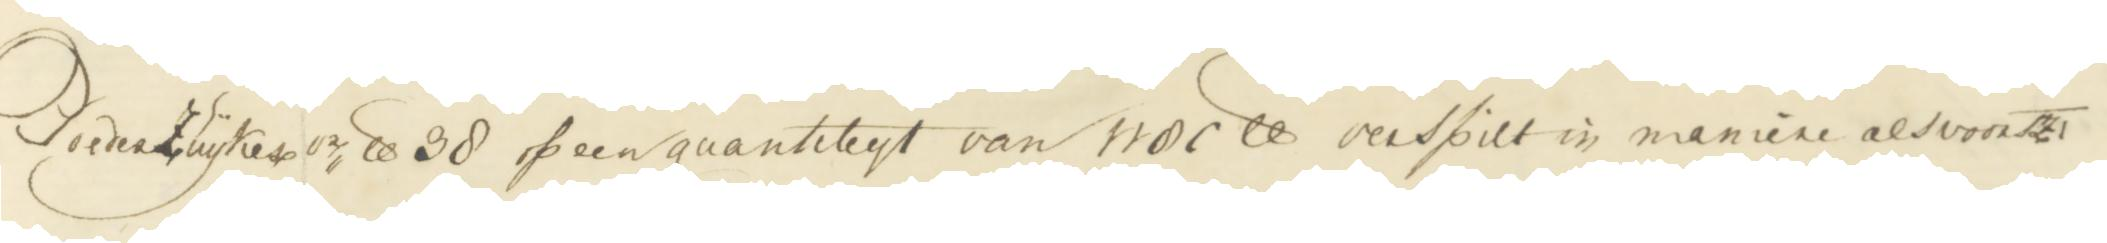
Poederzuijker v„r lb 38 op een quantiteyt van 1185 lb verspilt in maniere als voorsz:
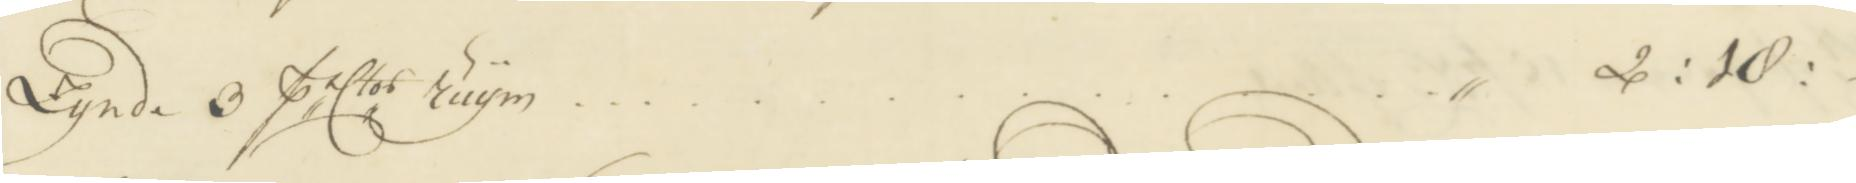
zynde 3 p„r c„tos ruijm . . . . . . . . . . . . . . . „ 2: 18:
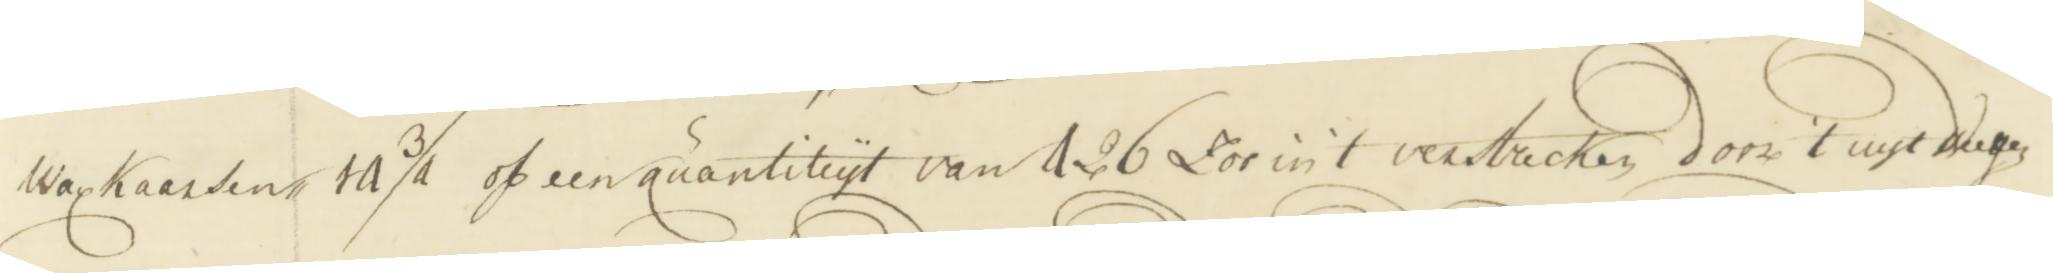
Waxkaarsen „ 14¾ op een quantiteijt van 426 zoo in ’t verstrecken door 't uyt deegen
